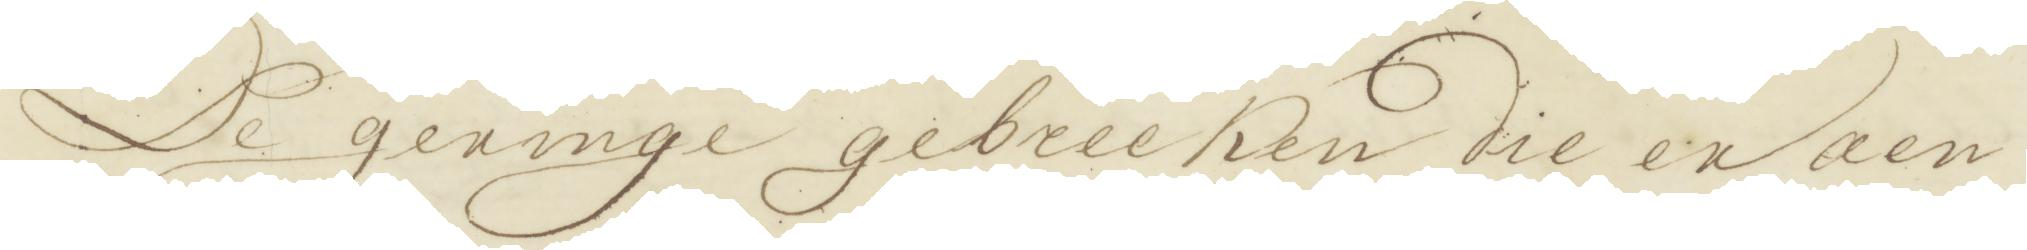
De geringe gebreeken die er aen
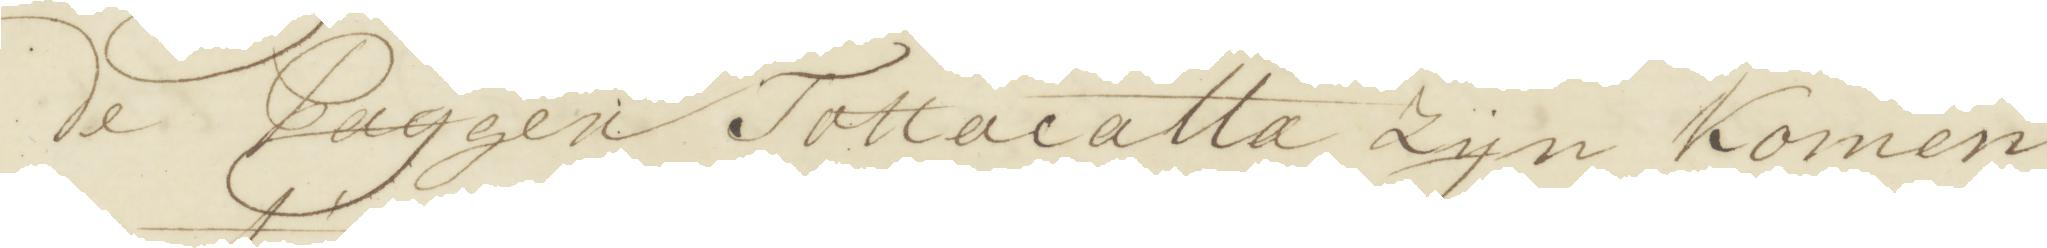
de Pagger Tottacatta zijn komen
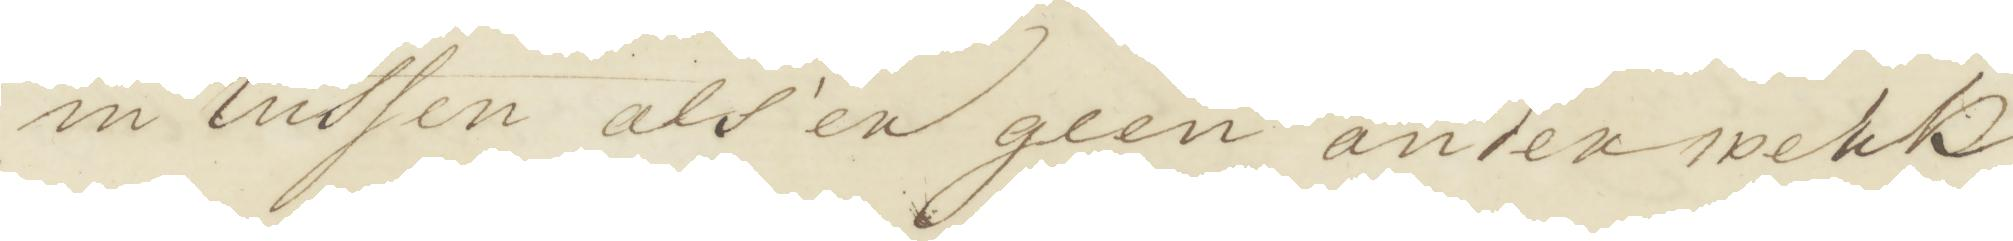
in tussen als 'er geen ander werk
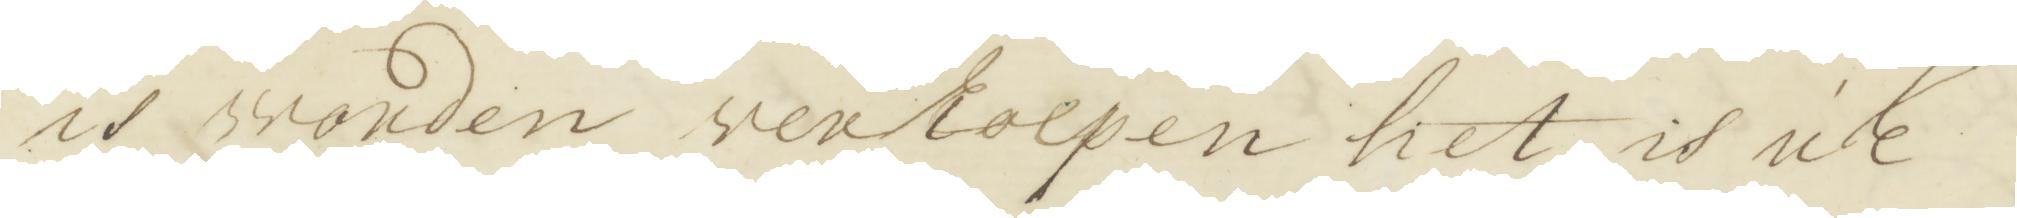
is worden verholpen het is uE
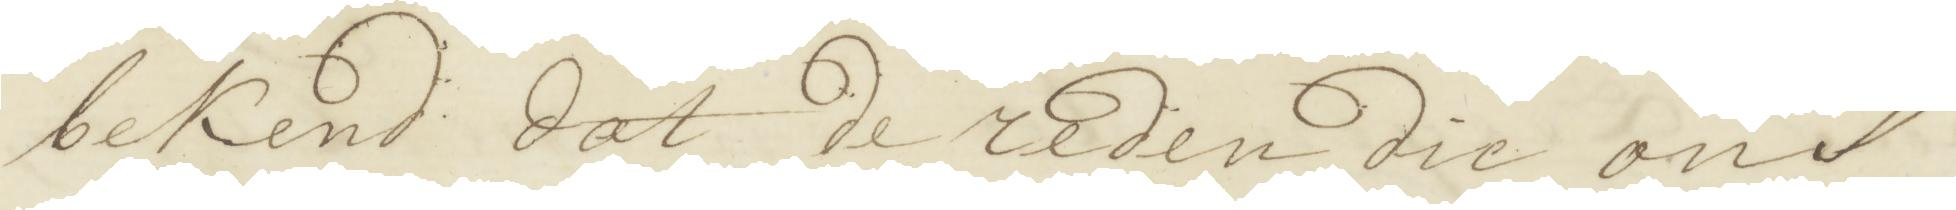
bekend dat de reden die ons
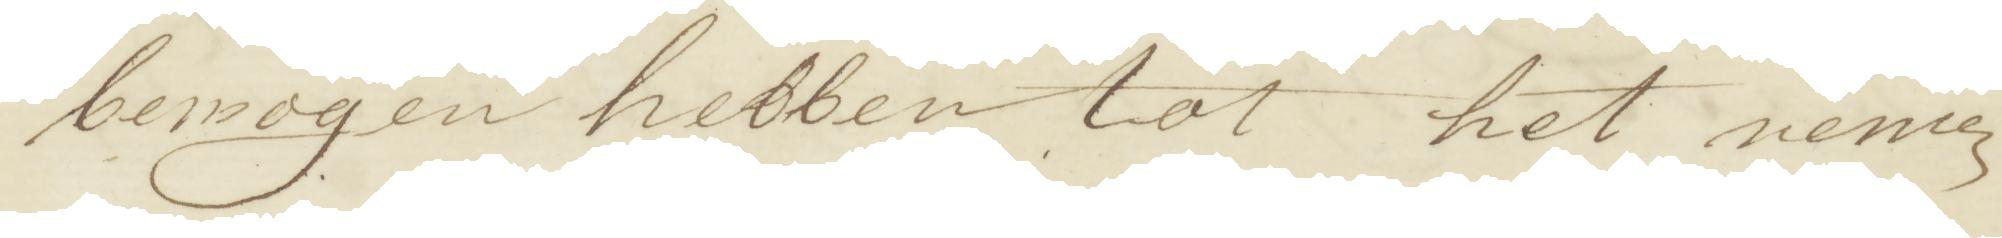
bewogen hebben tot het nemen
